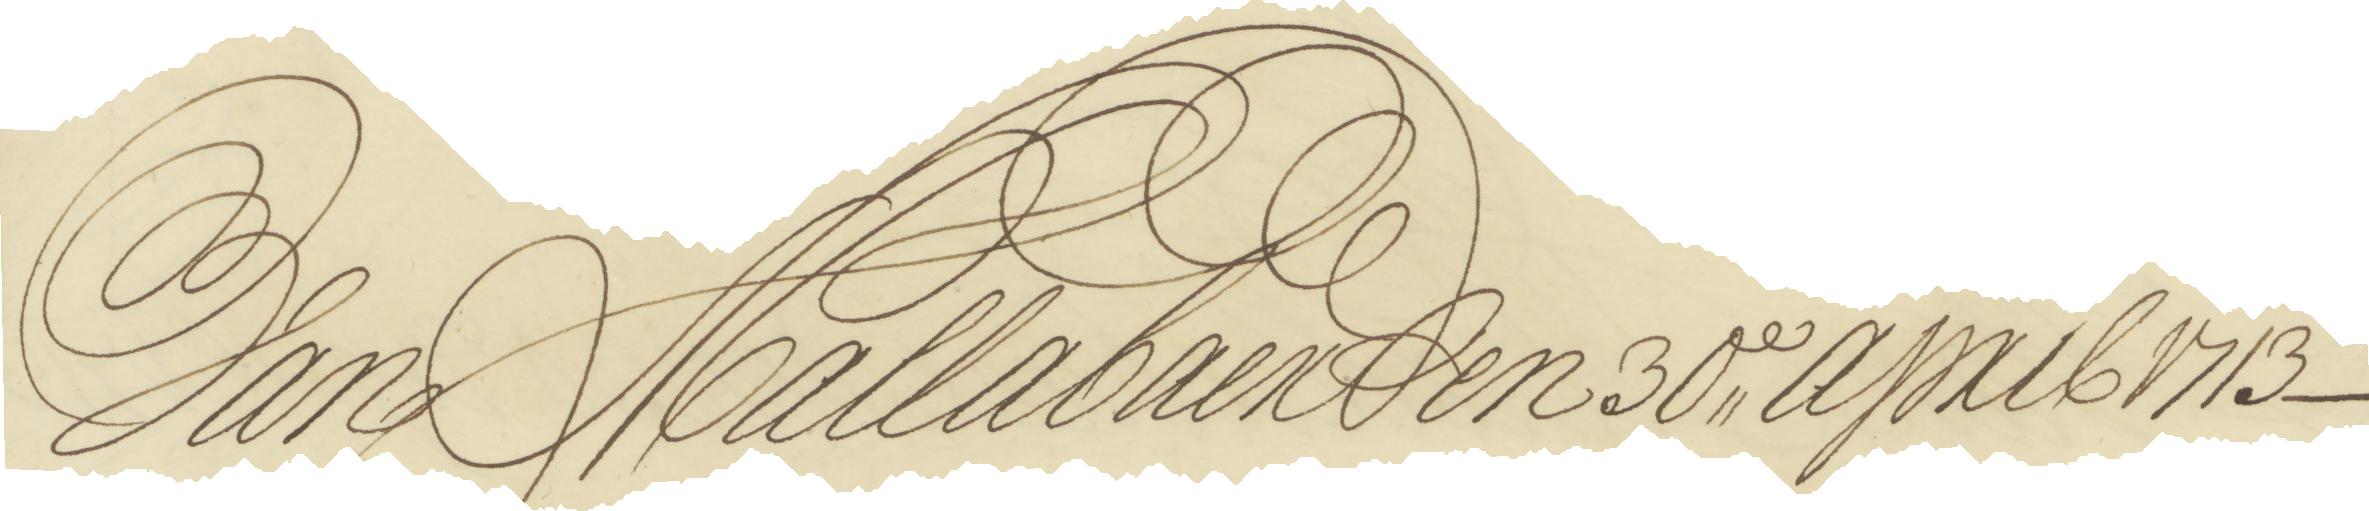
Van Mallabaer den 30„e april 1713—
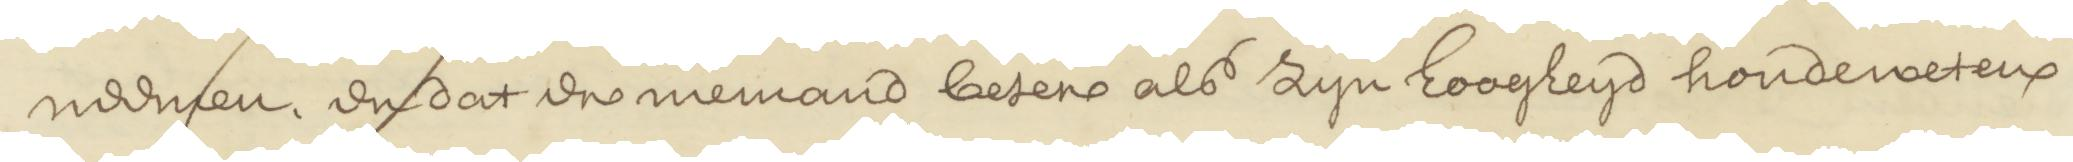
neemen, en dat er niemand beter als zijn hoogheyd konde weten
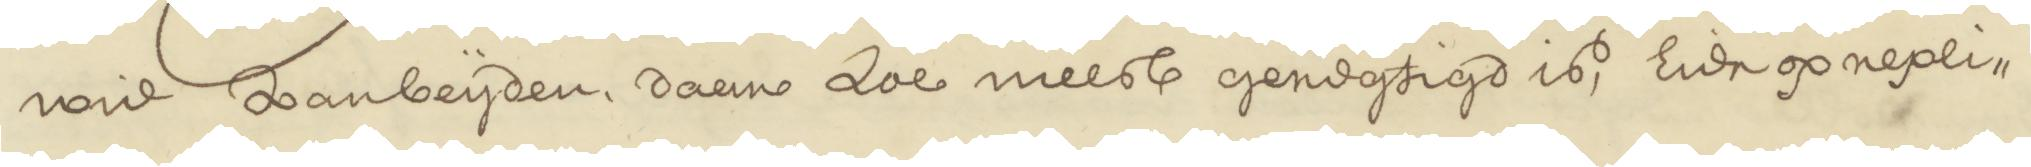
wie van beijden, daar toe meest geregtigd is, hier op repli„
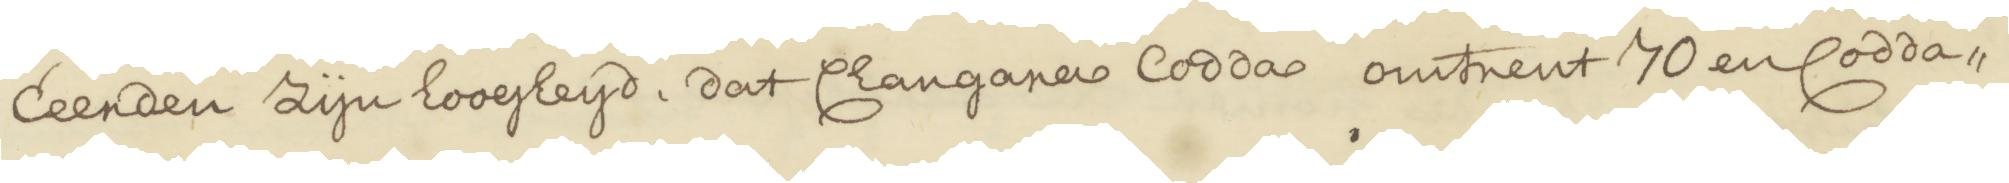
ceerden zijn hoogheijd, dat Changara Codda omtrent 70 en Codda„
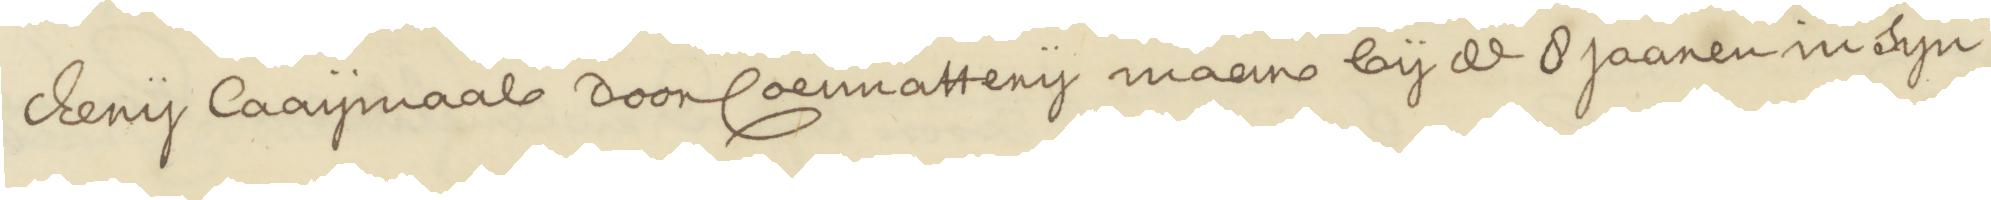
cherij Caaijmaal door Coennatterij maar bij de 8 jaaren in sijn
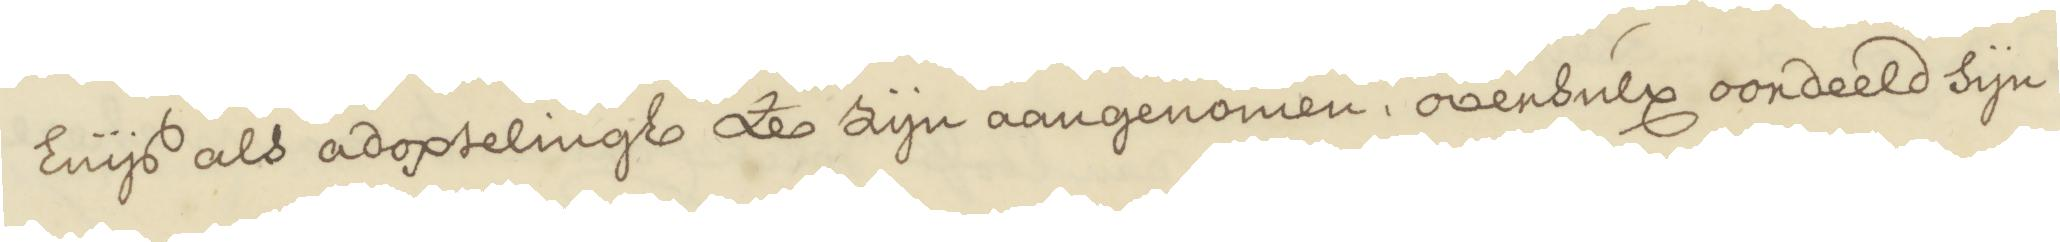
huijs als adoptelingh te zijn aangenomen, oversulx oordeeld sijn
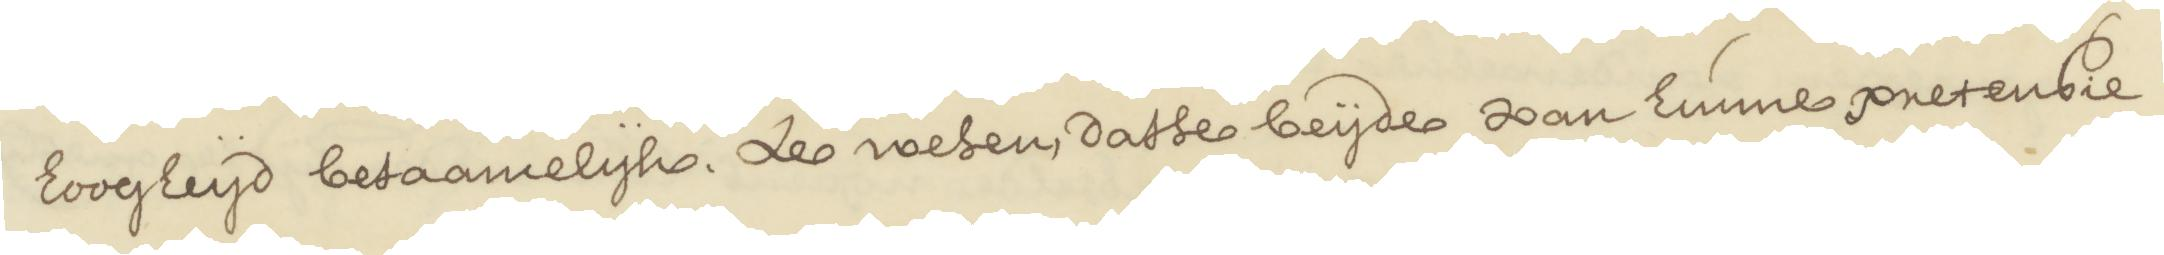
hoogheijd betaamelijk, te wesen, datse beijde van hunne pretensie
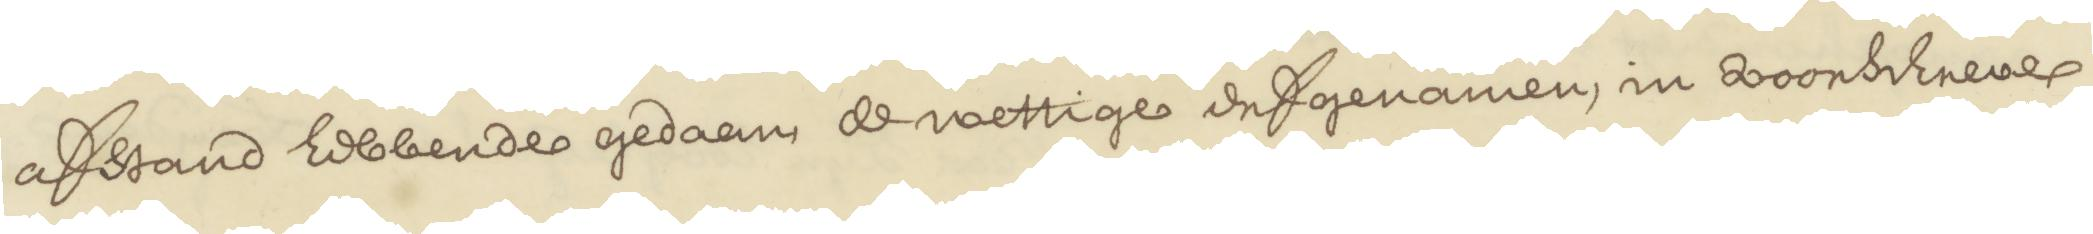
afstand hebbende gedaan, de wettige erfgenamen, in voorschreve
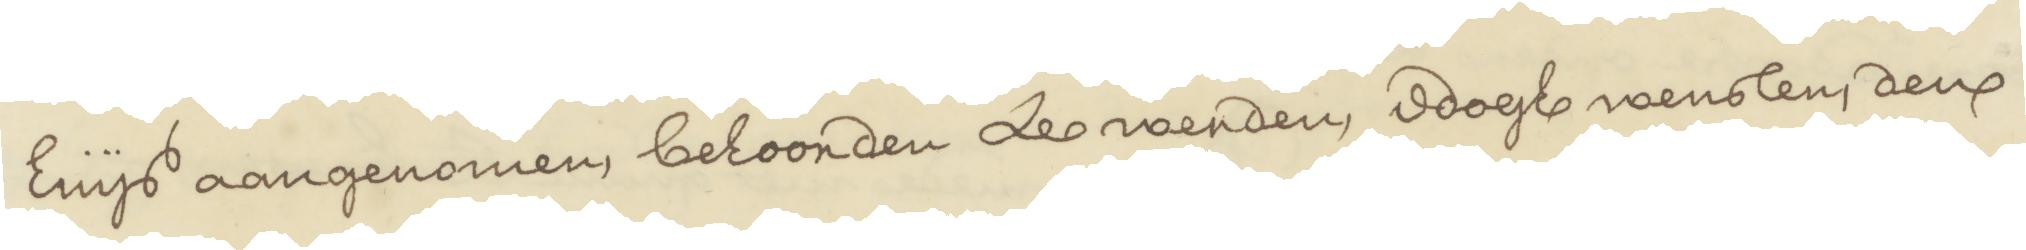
huijs aangenomen, behoorden te werden, edogh wensten, den
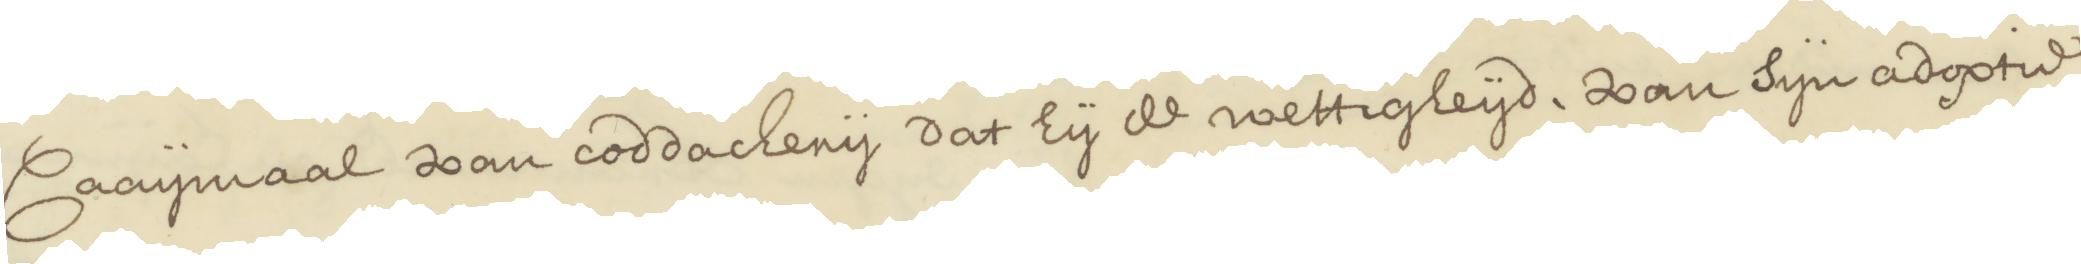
Caaijmaal van coddacherij dat hij de wettigheijd, van sijn adoptie
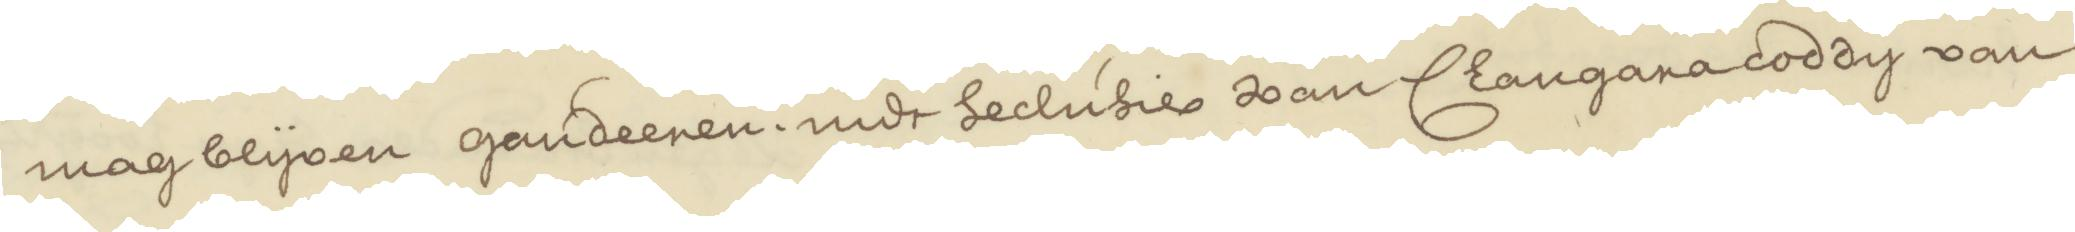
mag blijven gaudeeren, met seclusie van Changaracoddij van
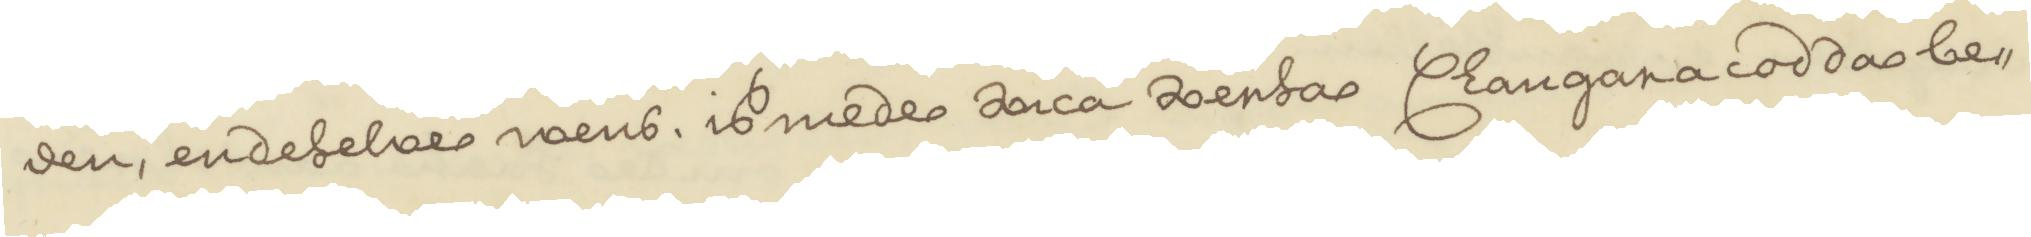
een, en deselve wens, is mede vica versa Changara codda be„
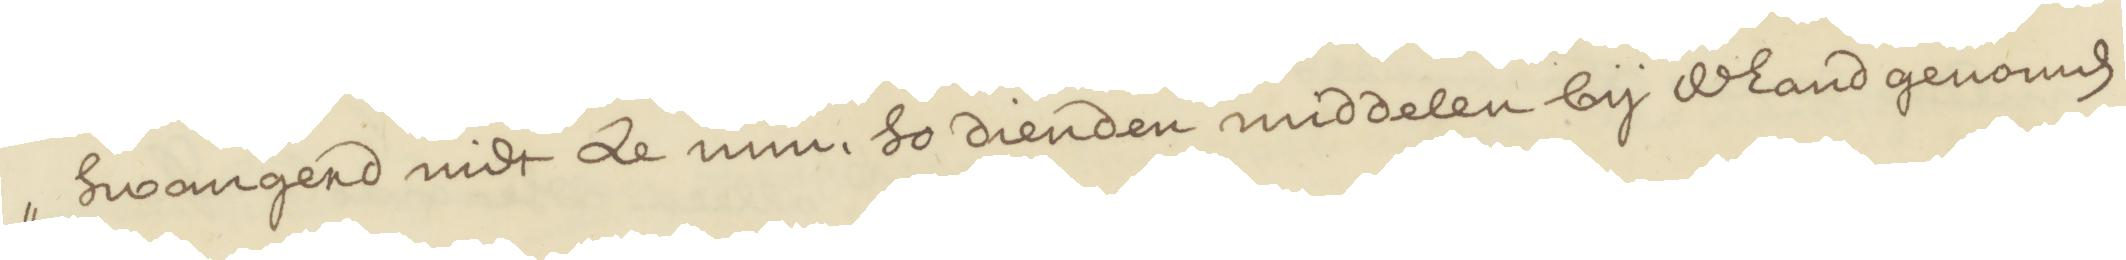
„swangerd niet te min: so dienden middelen bij dehand genomen
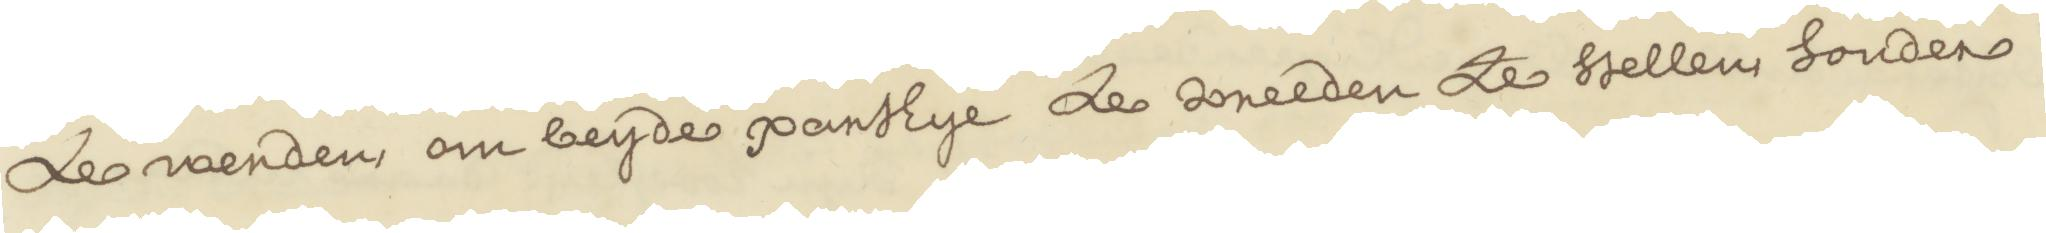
te werden, om beijde parthije te vreeden te stellen, sonder
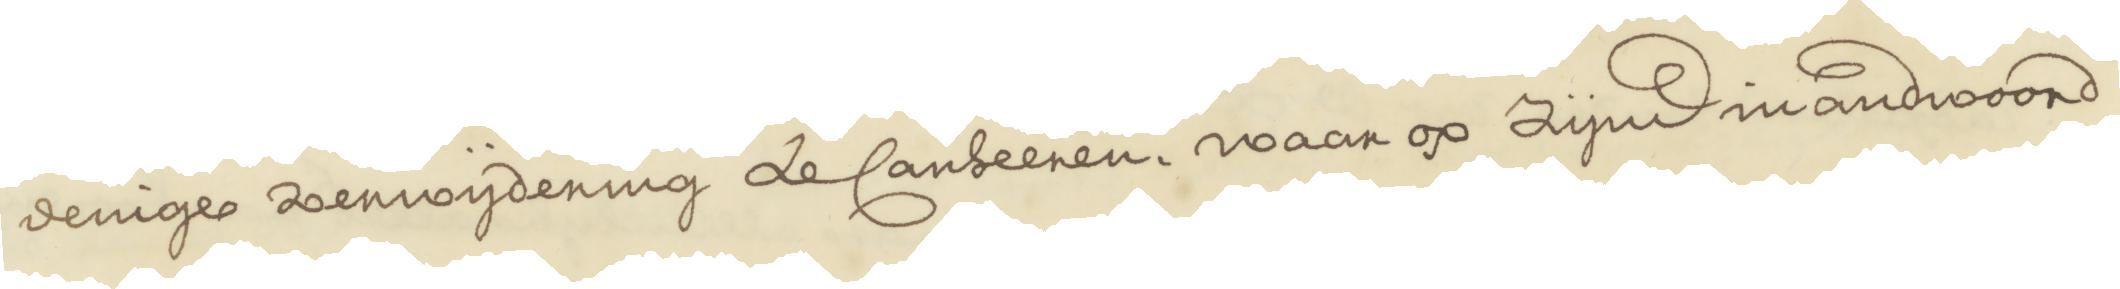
eenige verwijdering te causeeren, waar op zijne in andwoord
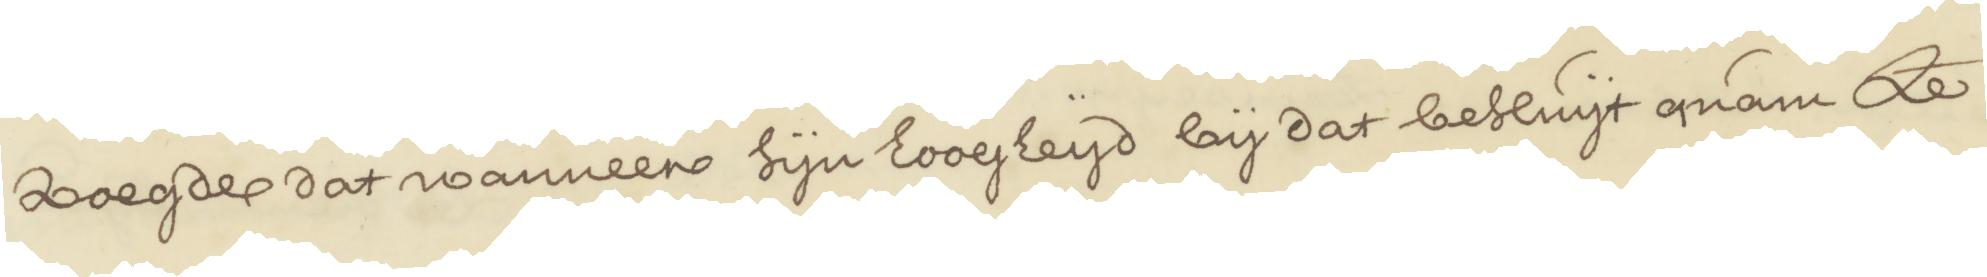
voegde dat wanneer sijn hoogheijd bij dat besluijt quam te
